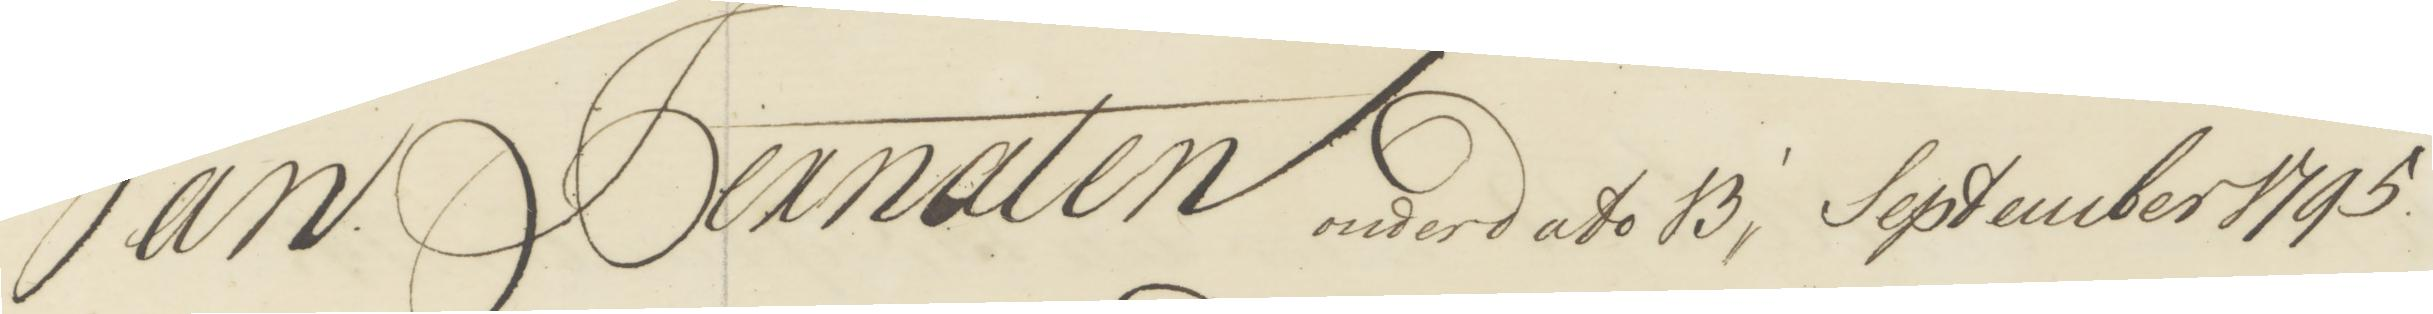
Van Ternaten onder dato 13„' September 1745.
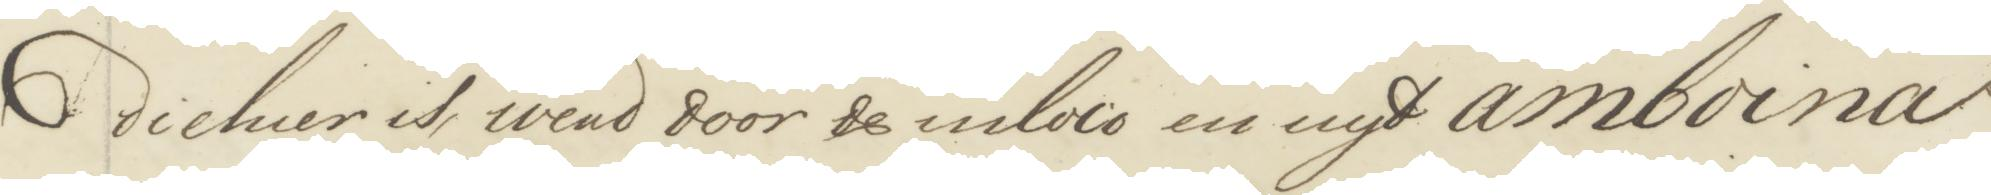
die hier is, werd door de inloco en uijt amboina
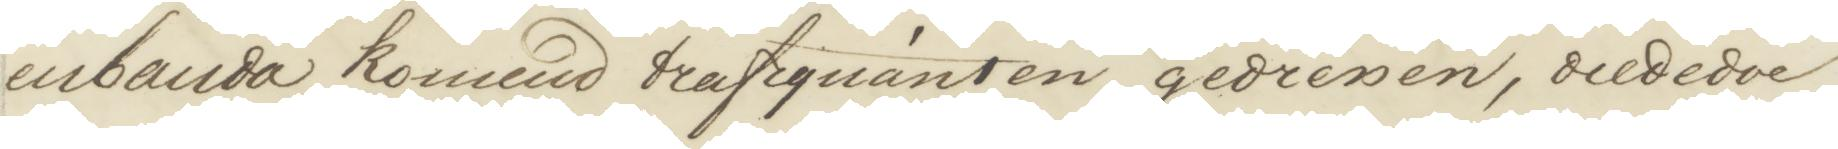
en banda komend trafiquanten gedreven, die de doe
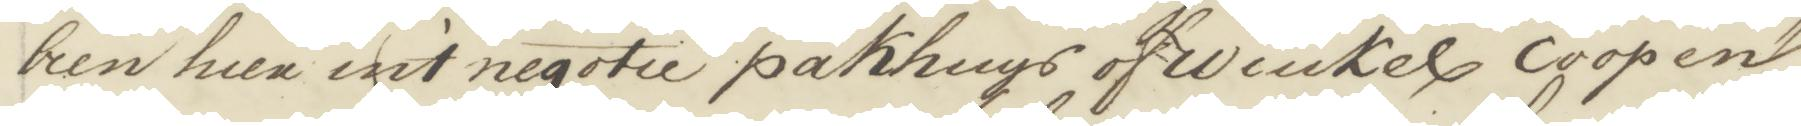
ken hier in’t negotie pakhuijs, of winkel coopen
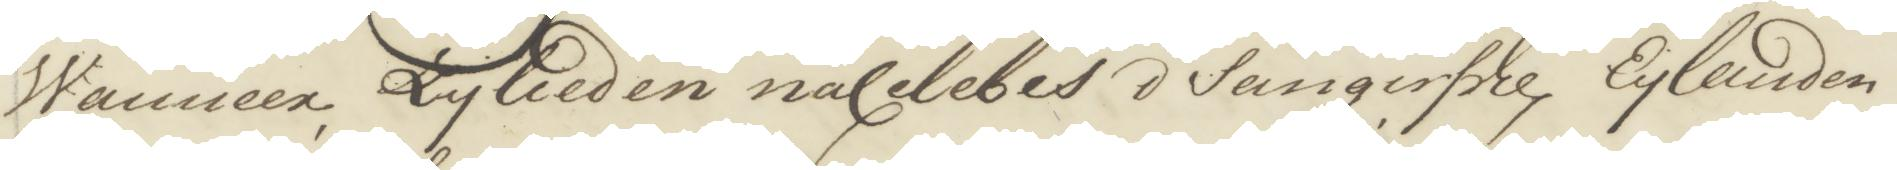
Wanneer zij lieden na celebes d'sangirssche, Eijlanden
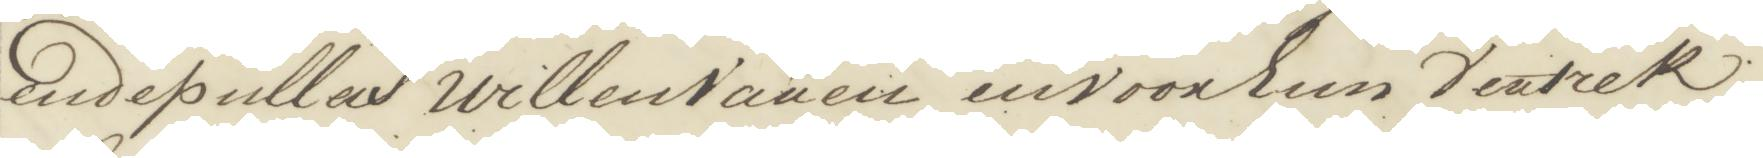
ende pullas willen varen en voor hun vertrek
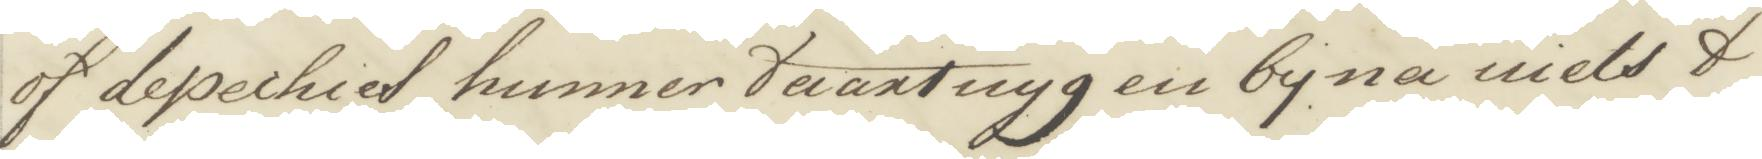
of depechies hunner vaartuijg en bij na niets 't
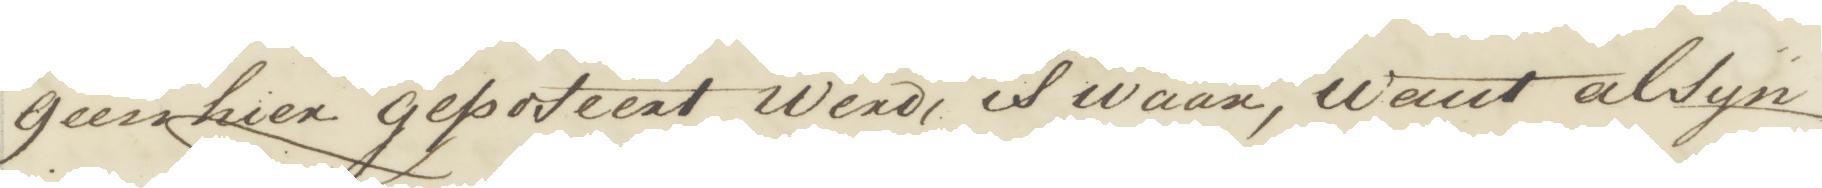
geen hier geposeert werd, is waar, want alsijn
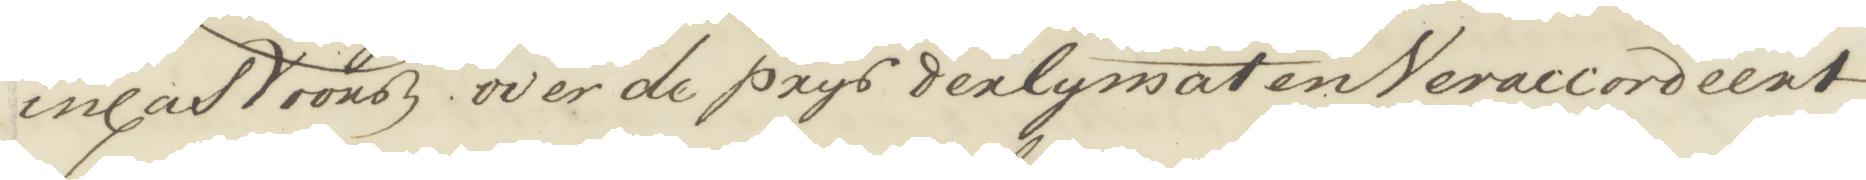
incas voorsz over de prijs der lijwaten Veraccordeert
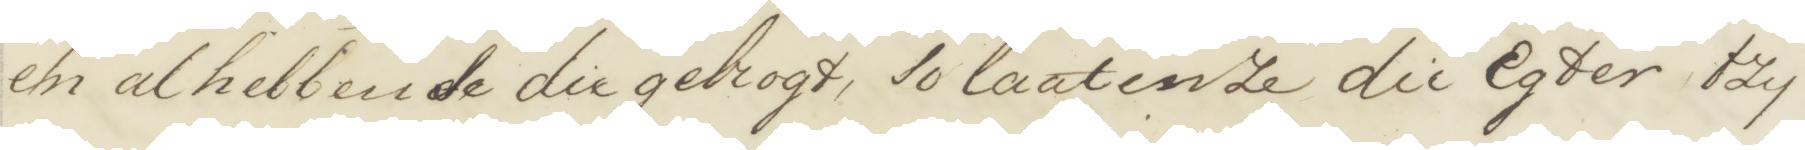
en al hebbende die gekogt, so laaten ze die Egter tzy
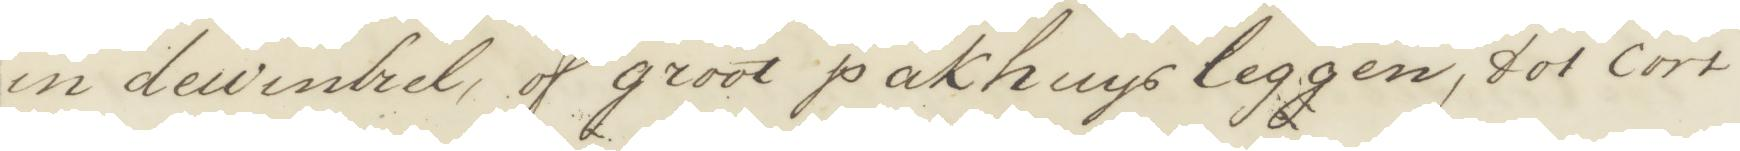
in de winkel, of groot pakhuijs leggen, tot cort
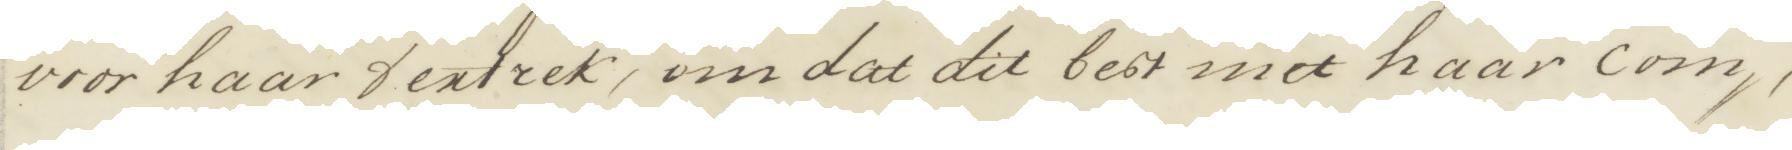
voor haar vertrek, om dat dit best met haar Com„
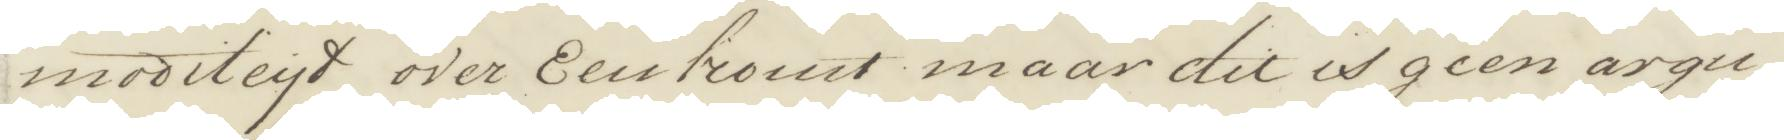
moditeijt over Een komt maar dit is geen argu
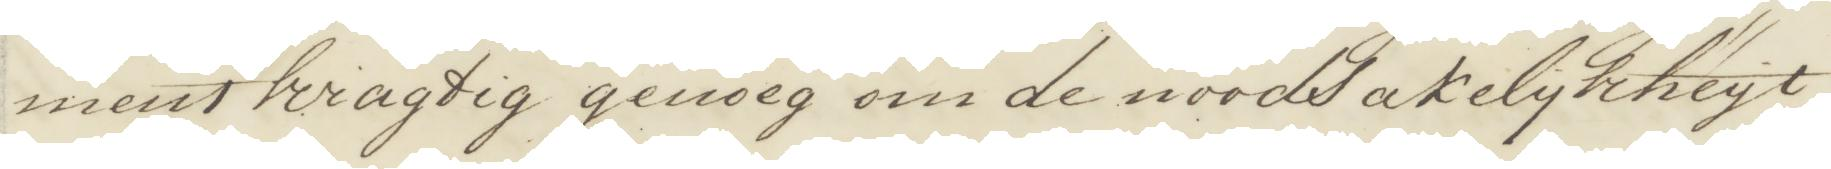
ment kragtig genoeg om de noodsakelijkheijt
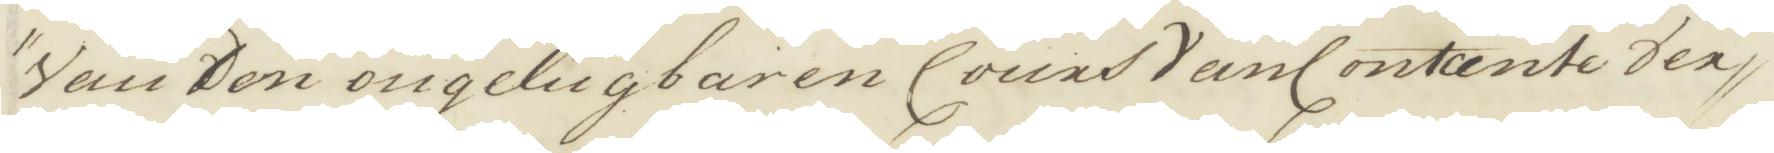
van den ongelugbaren Cours van Contante ver„
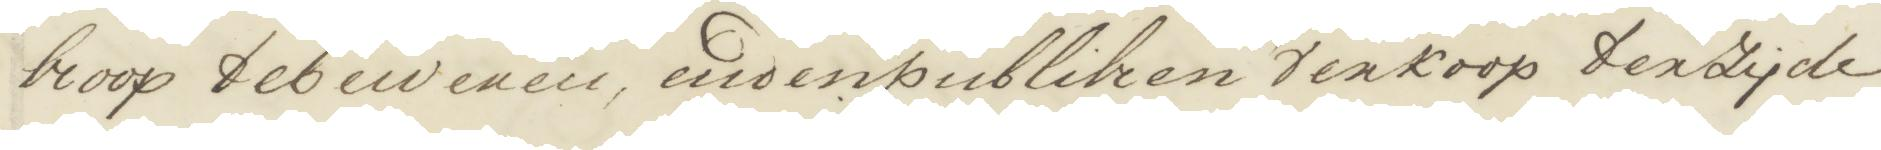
koop tebeweren, enden publiken verkoop ter zijde
